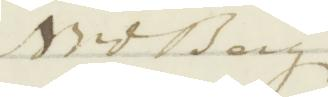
VdBerg
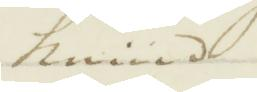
hund
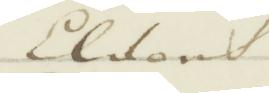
huurd
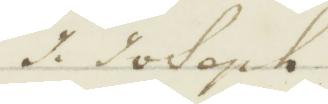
I. Ioseph
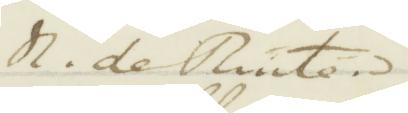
N. de Ruiter
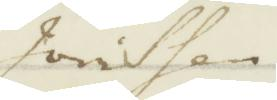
Jenissen
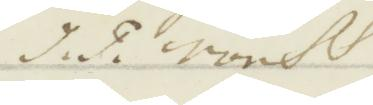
I:I Vonst
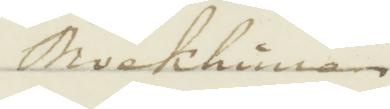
Boekhouwer
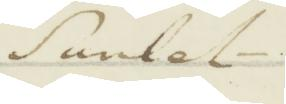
Sarlet-
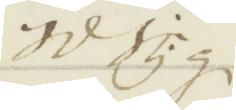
W Vyg
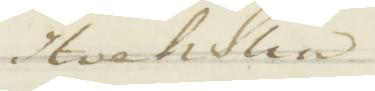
Hoekken
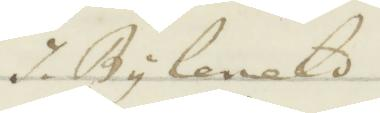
I. Bijleveld
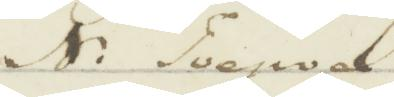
N: Toepoel
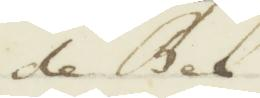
de Bel
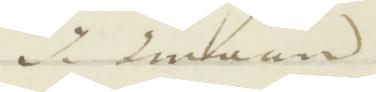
I Zwaan
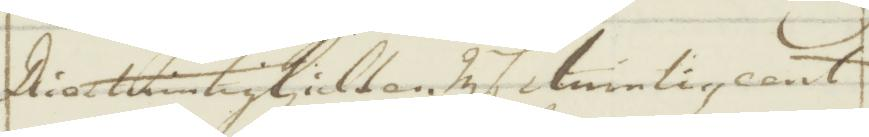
Drieentwintig Gulden vyf en twintig cents
